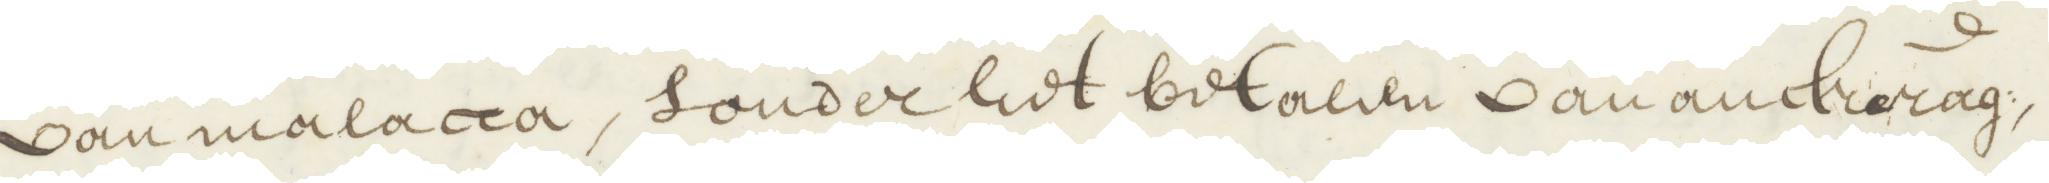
van malacca, sonder het betalen van anckerag:,
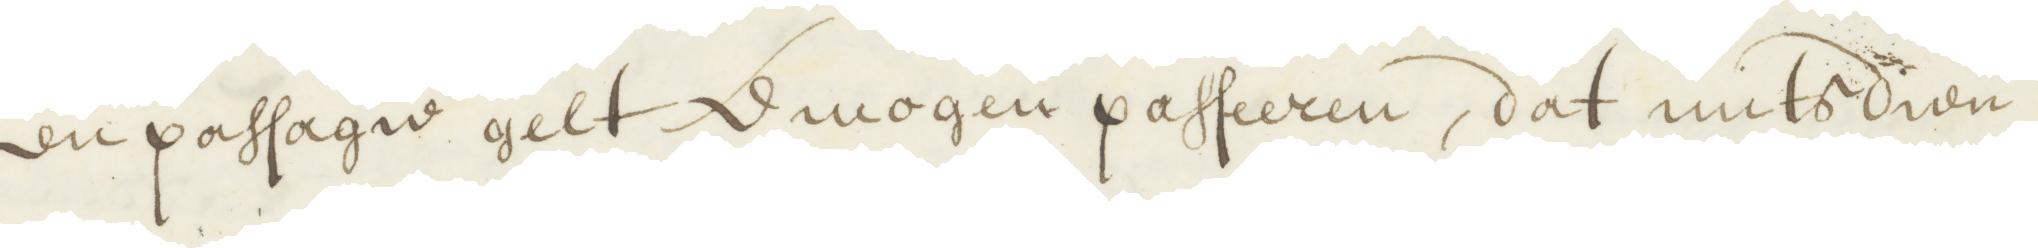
en passagie gelt te mogen passeeren, dat mits dien
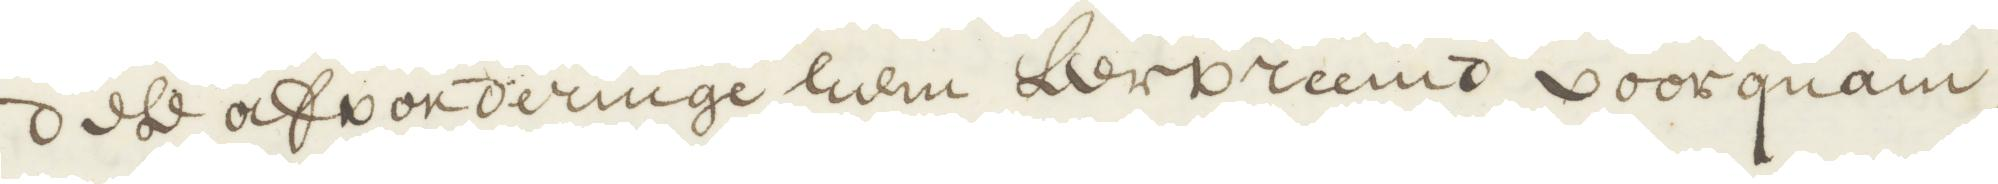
dese afvorderinge hem seervreemd voorquam,
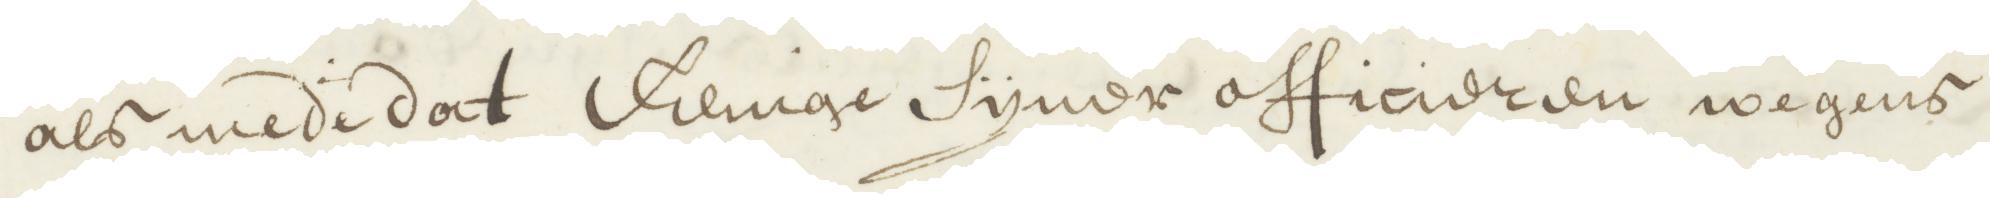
als mede dat Eenige sijner officieren wegens
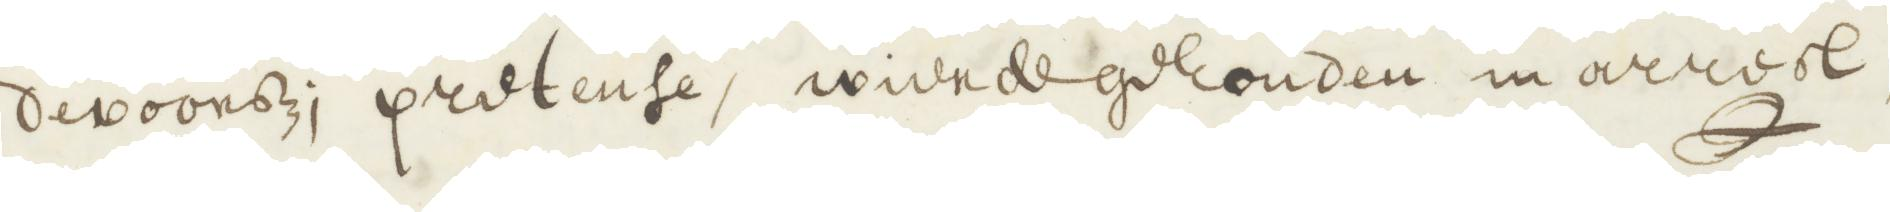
de voors; pretense, wierde gehouden in arrest,
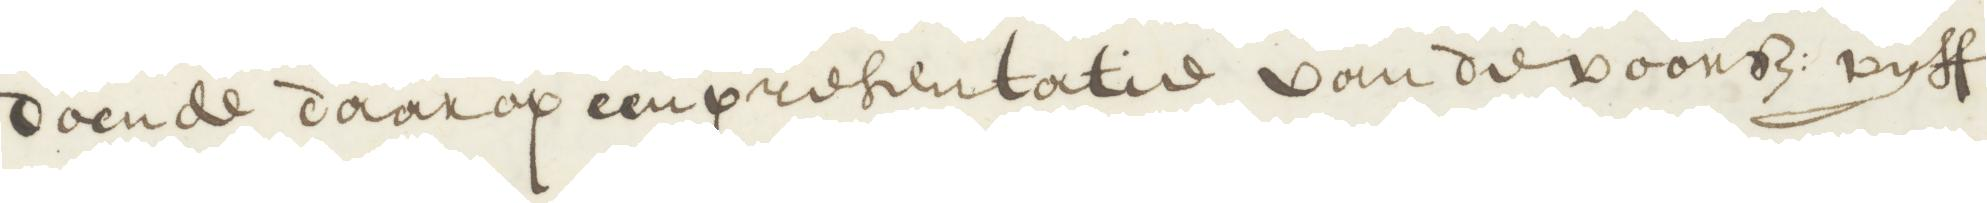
doen de daarop een presentatie van de voors: vijff
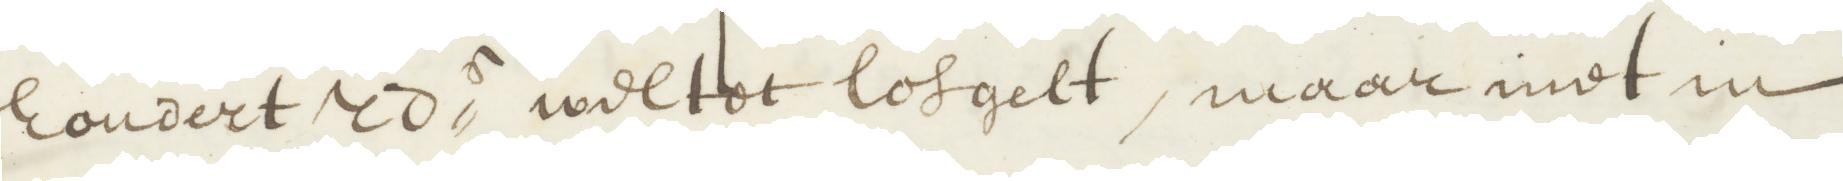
hondert rd„s wel tot losgelt, maar niet in
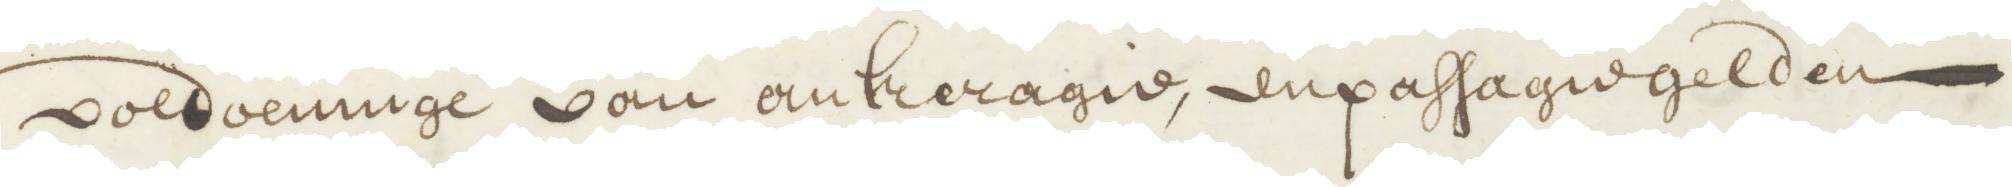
voldoeninge van ankeragie, en passagie gelden
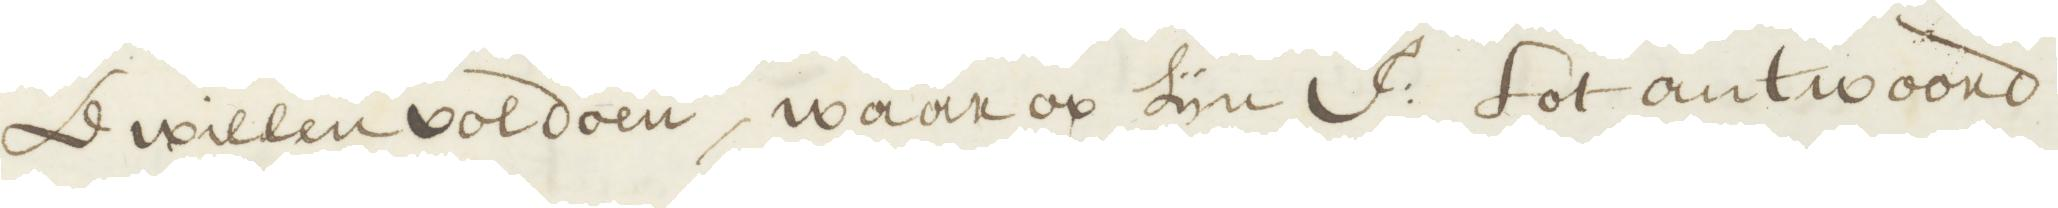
te willen voldoen, waar op sijn E: tot antwoord
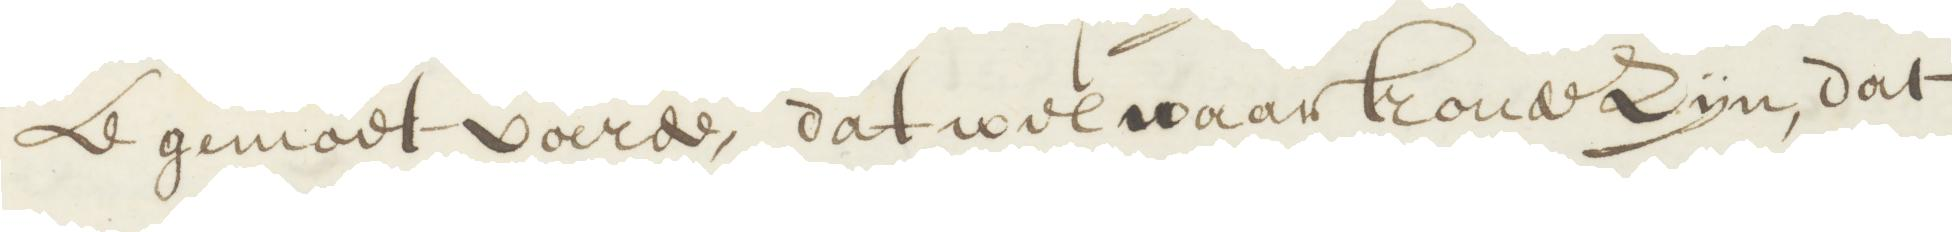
te gemoet voerde, dat wel waar konde zijn, dat
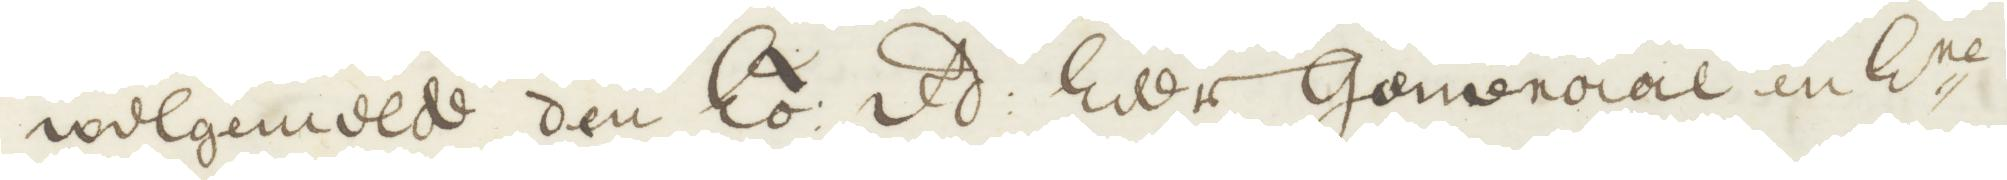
wel gemelde den ho: Ed: heer Generaal en h„re
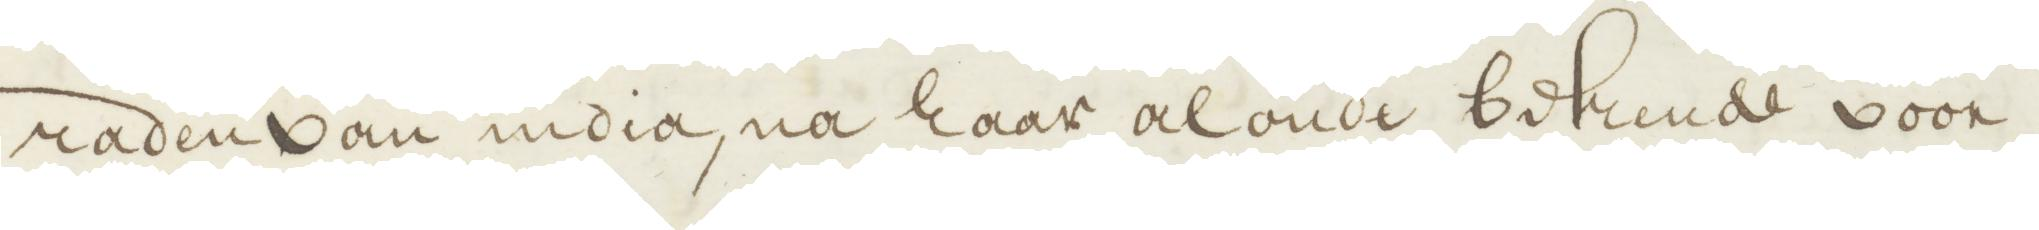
raden van india, na haar al oude bekende voor
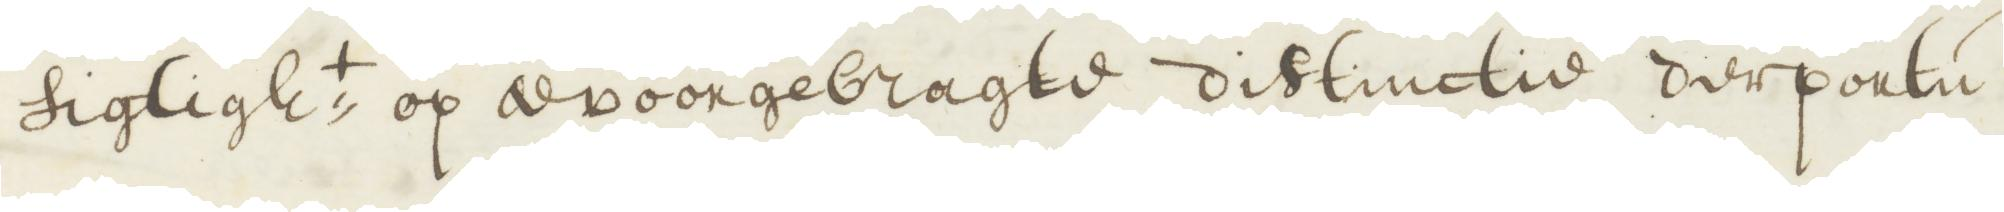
sigtigh„t op de voorgebragte distinctie der portu
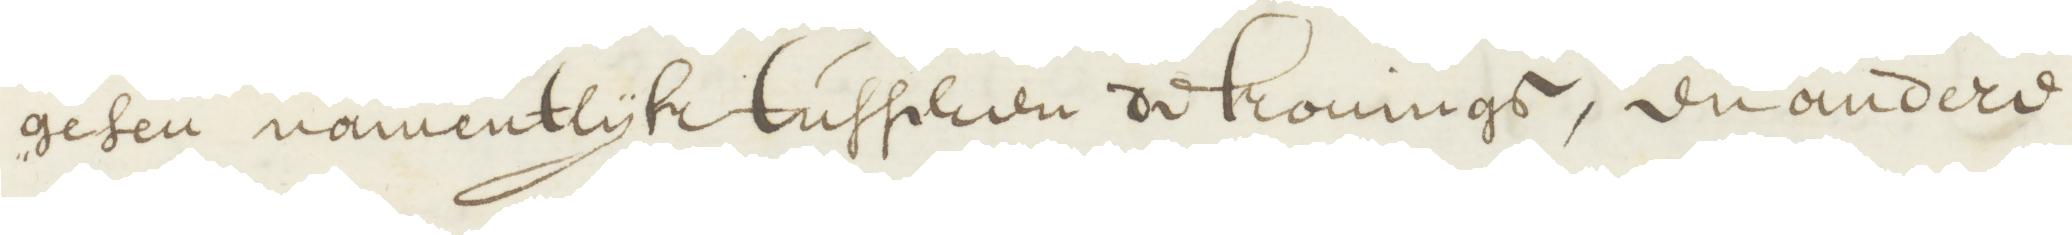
„gesen namentlijk tusschen de konings, en andere
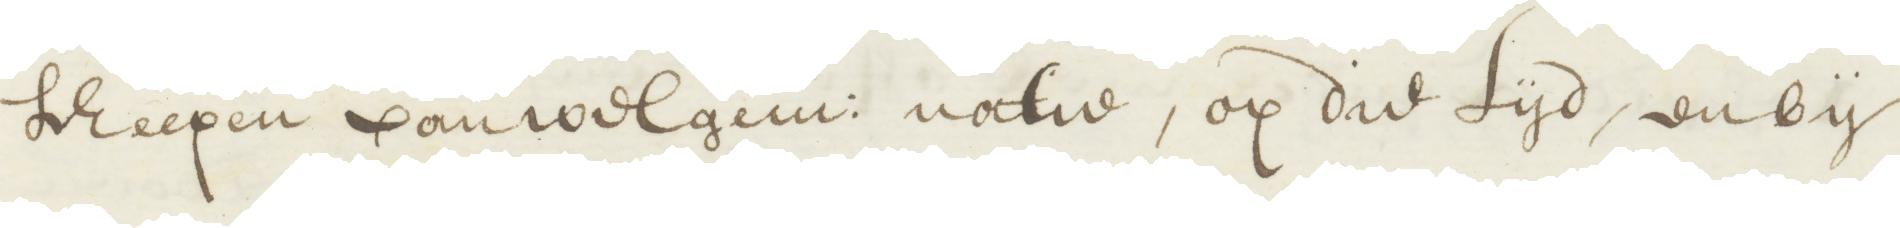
scheepen van welgem: natie, op die tijd, en bij
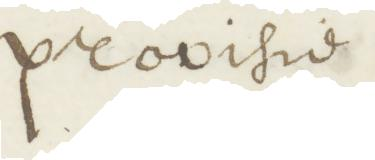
provisie
